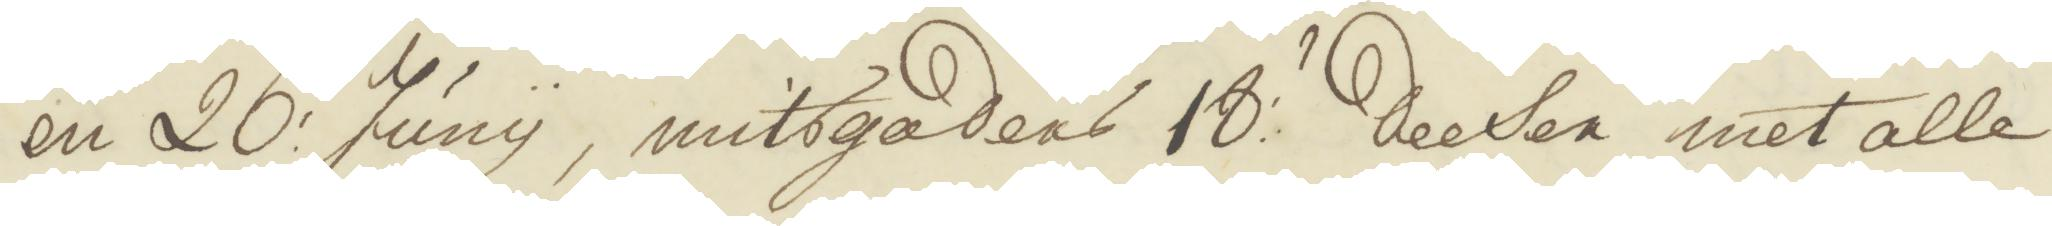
en 26: Junij, mitsgaders 18:' deeser met alle
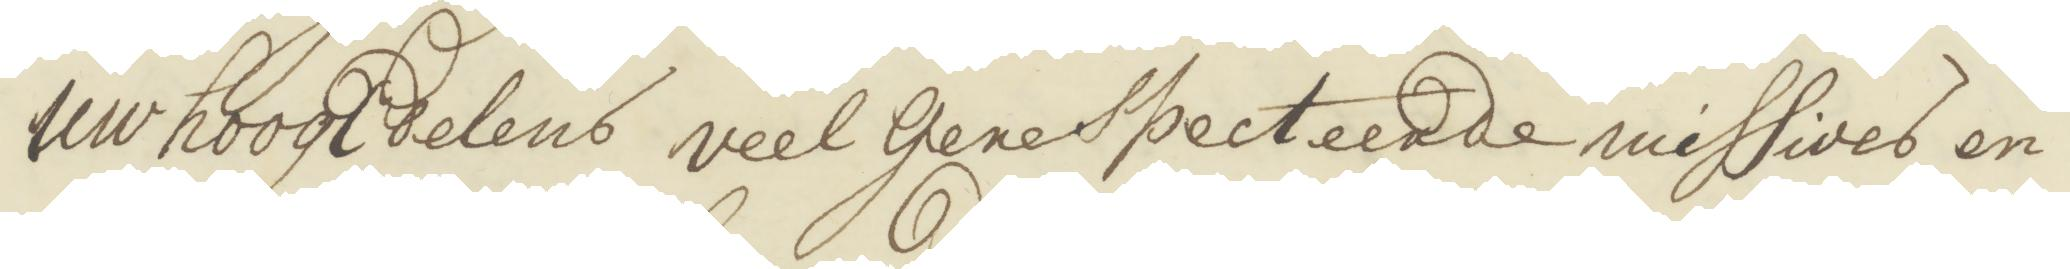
uw hoogEdelens veel gerespecteerde missives en
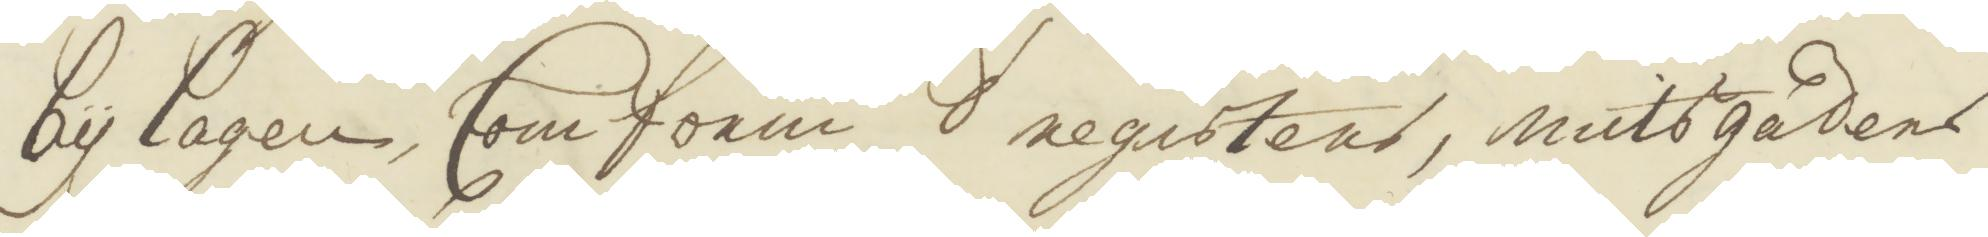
bij lagen, Conform d’ registers, mitsgaders
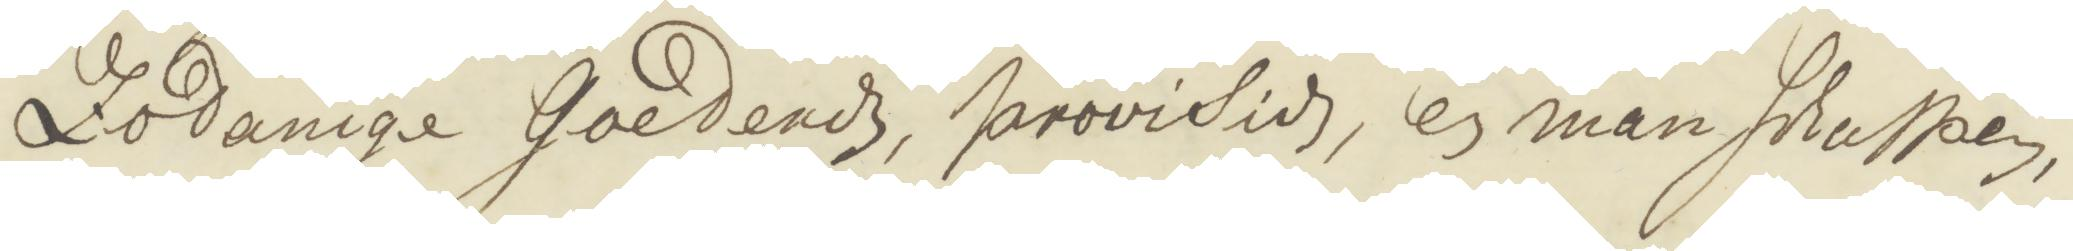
Zodanige goederen, provisien, en man schappen,
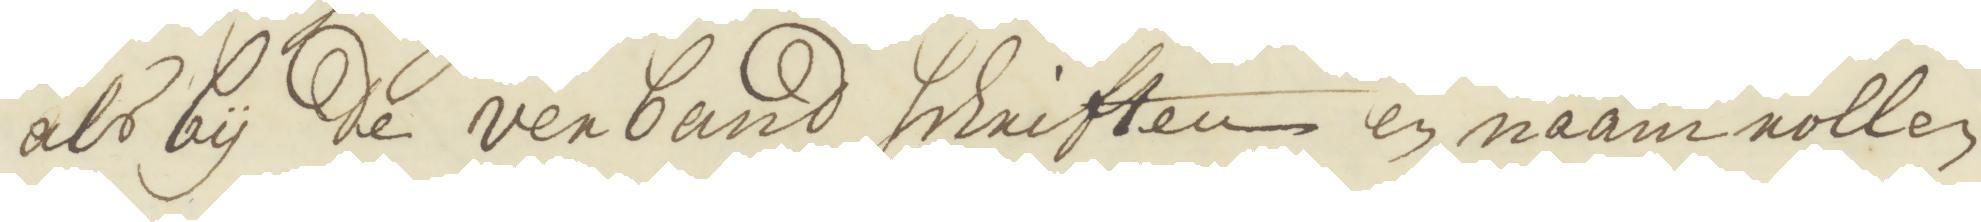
als bij de verband schriften en naam rollen
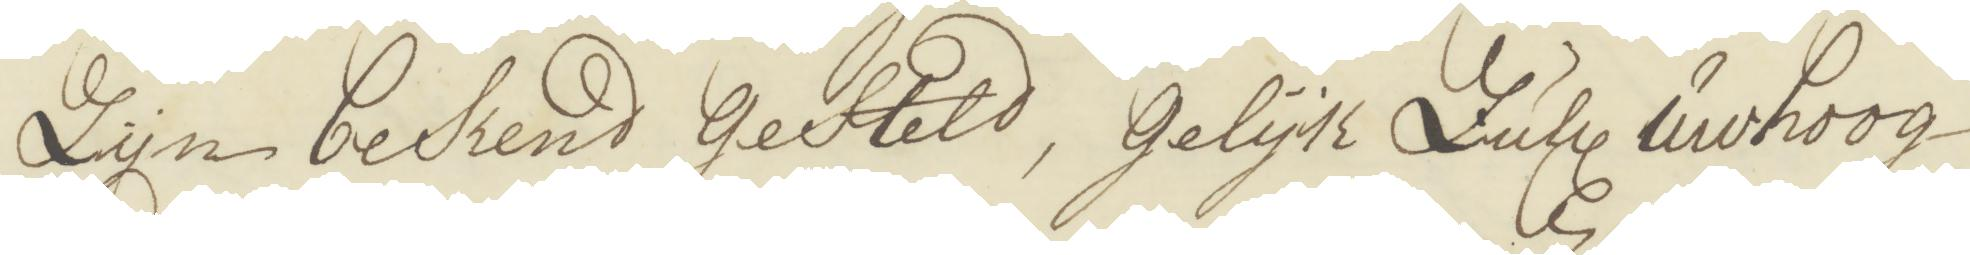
Zijn bekend gesteld, gelijk Zulx uwhoog
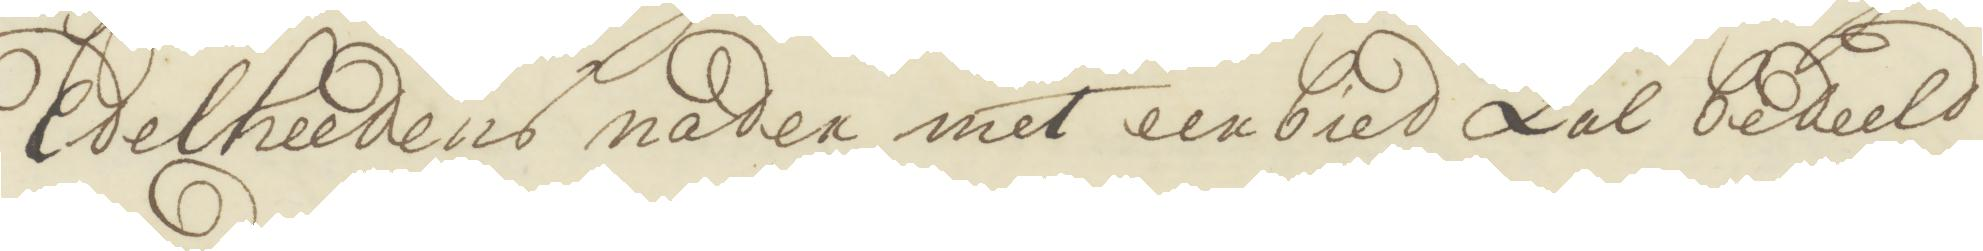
Edelheedens nader met eerbied Zal bedeeld
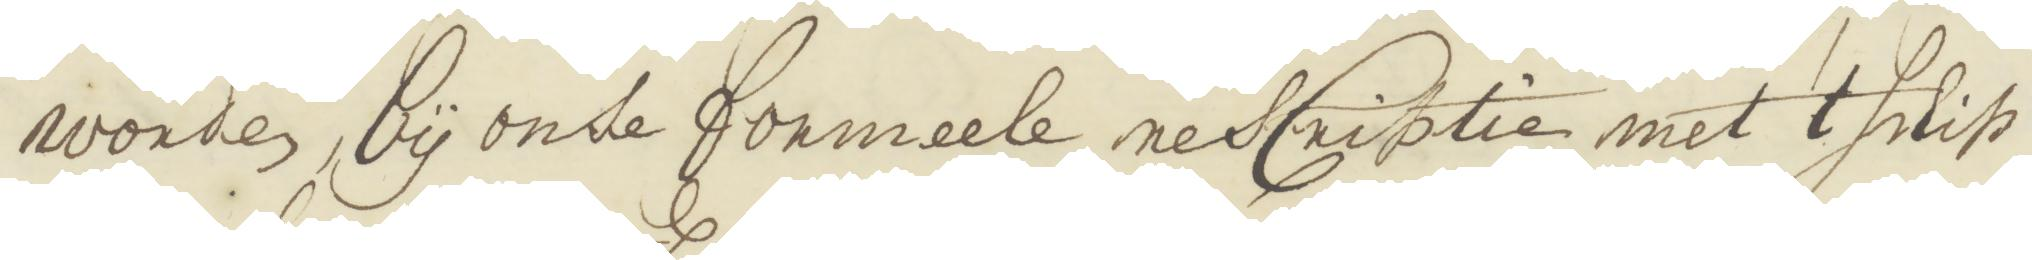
worden, bij onse formeele rescriptie met ’t schip
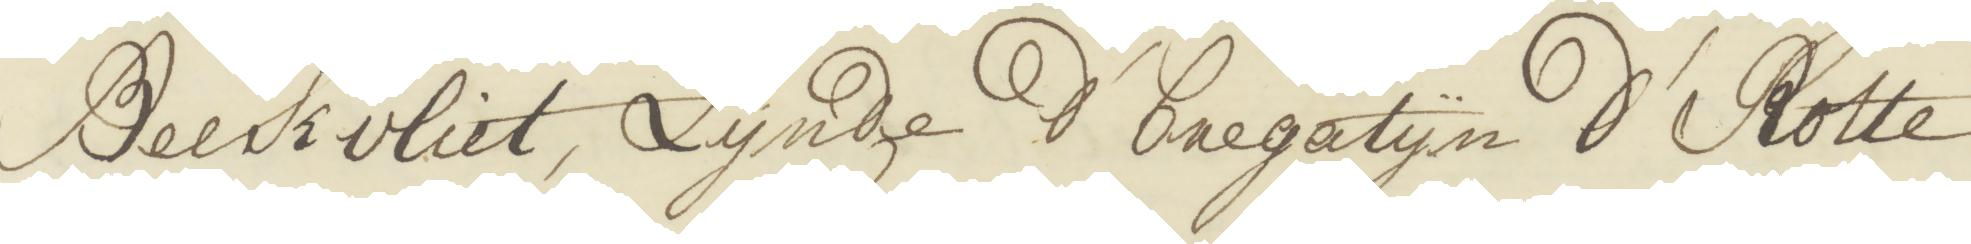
Beekvliet, Zijnde d’ bregatijn d’ Rotte
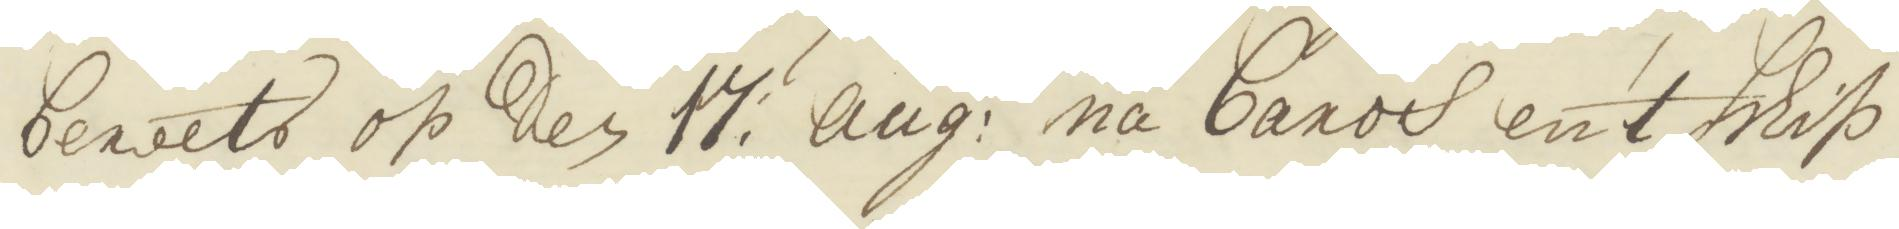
bereets op den 17:' Aug:s na baros en ’t schip
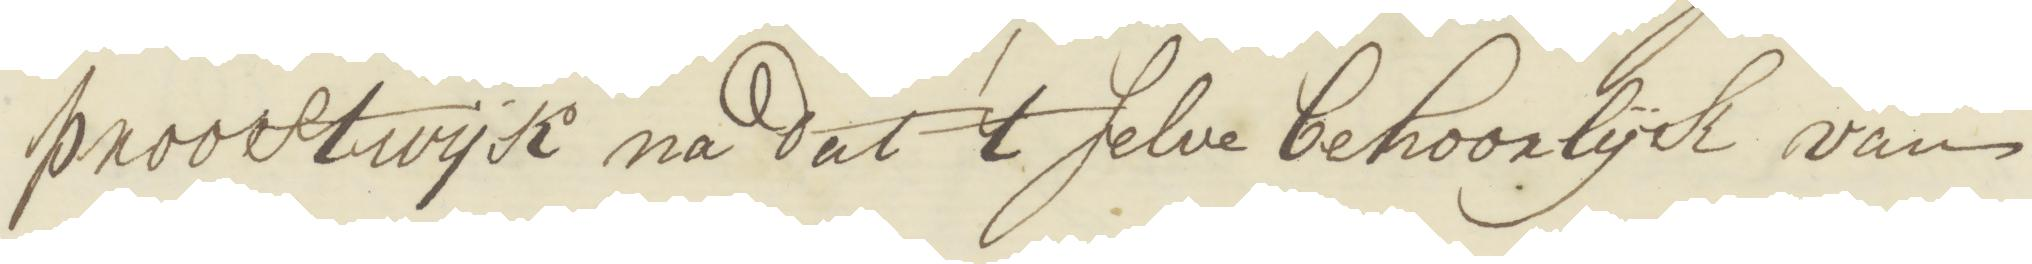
proostwijk na dat ’t selve behoorlijk van
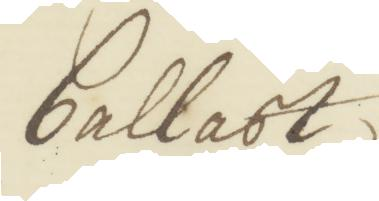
ballast
